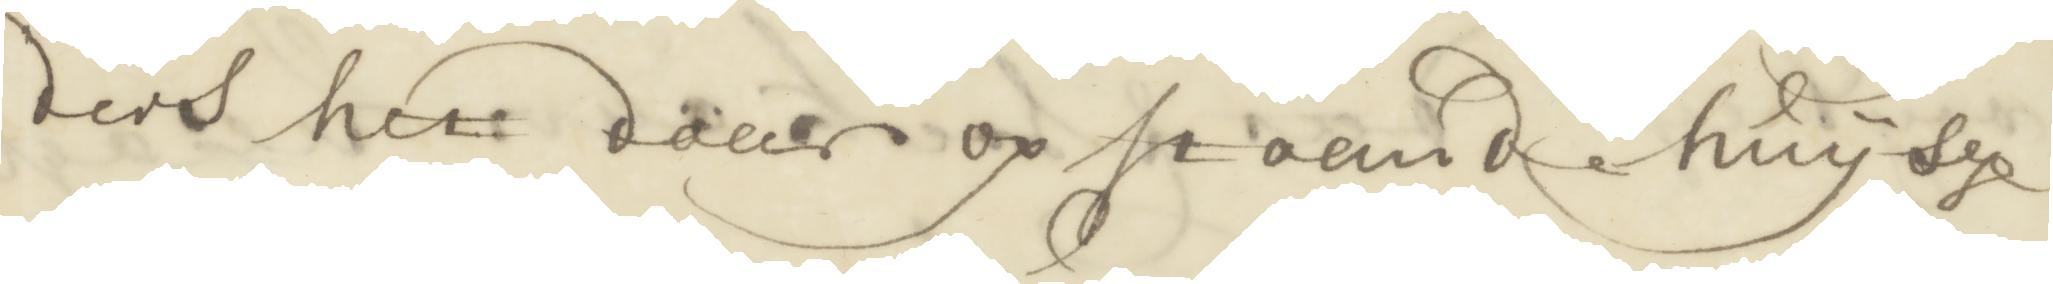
ders het daar op staande huijsje
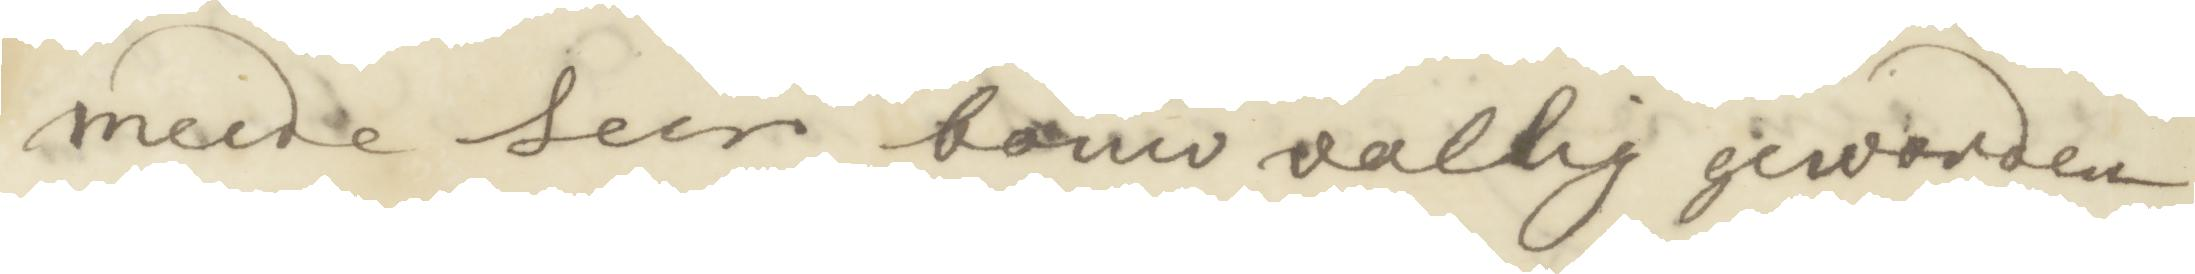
meede seer bouw vallig geworden
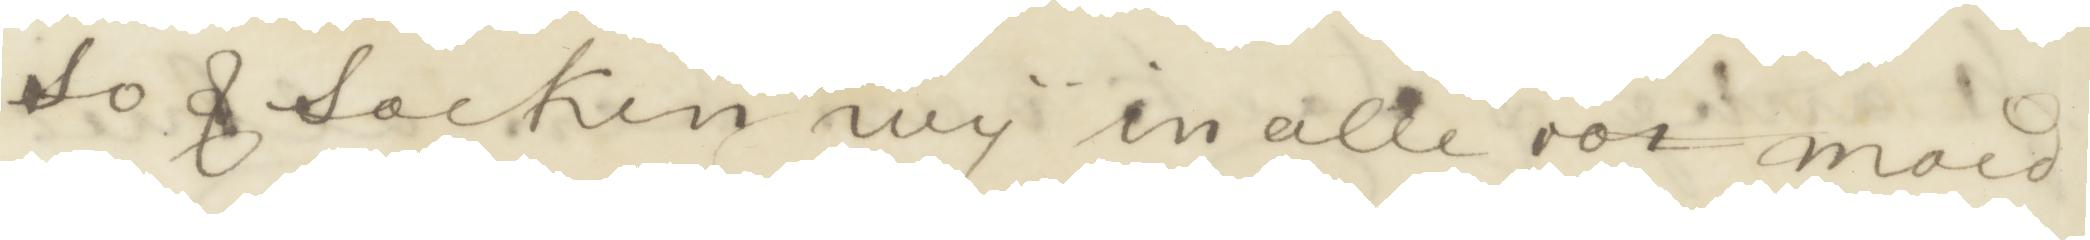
so versoeken wij in alle oot moed
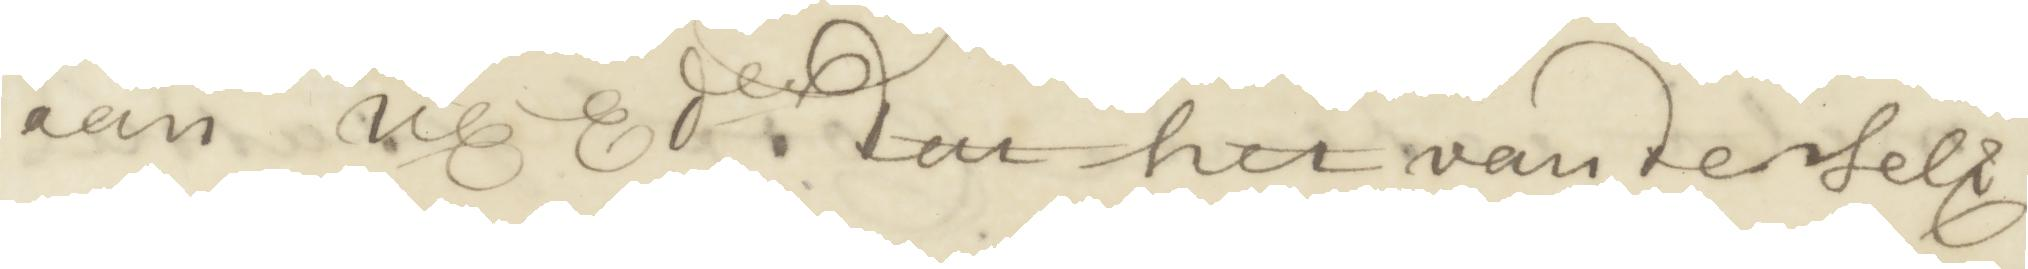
aan UE Ed-e dat het van derselve
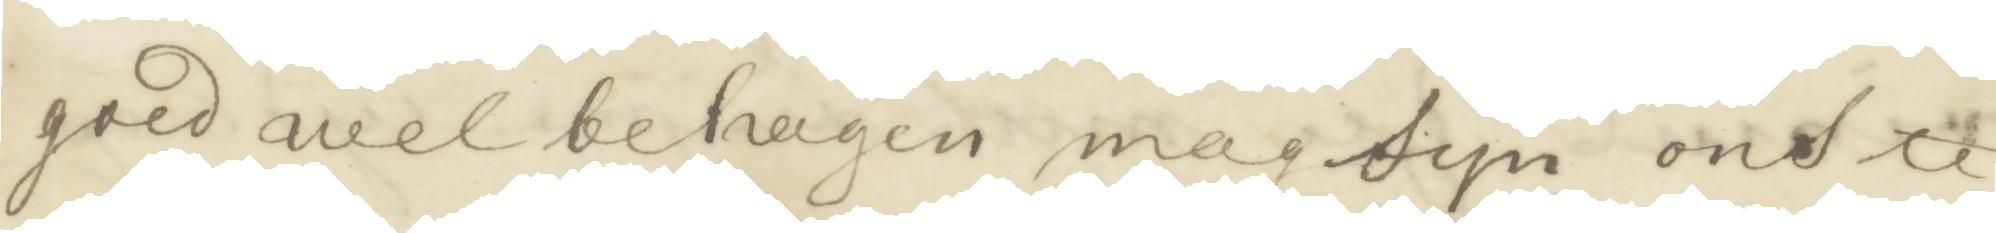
goed wel behagen mag sijn ons te
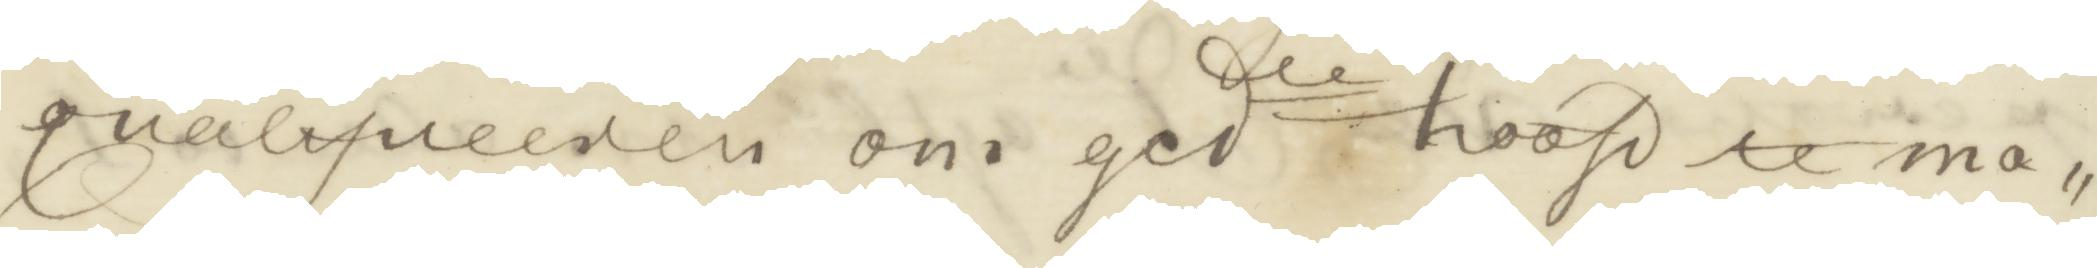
qualificeeren om ged:e hoofd te mo„
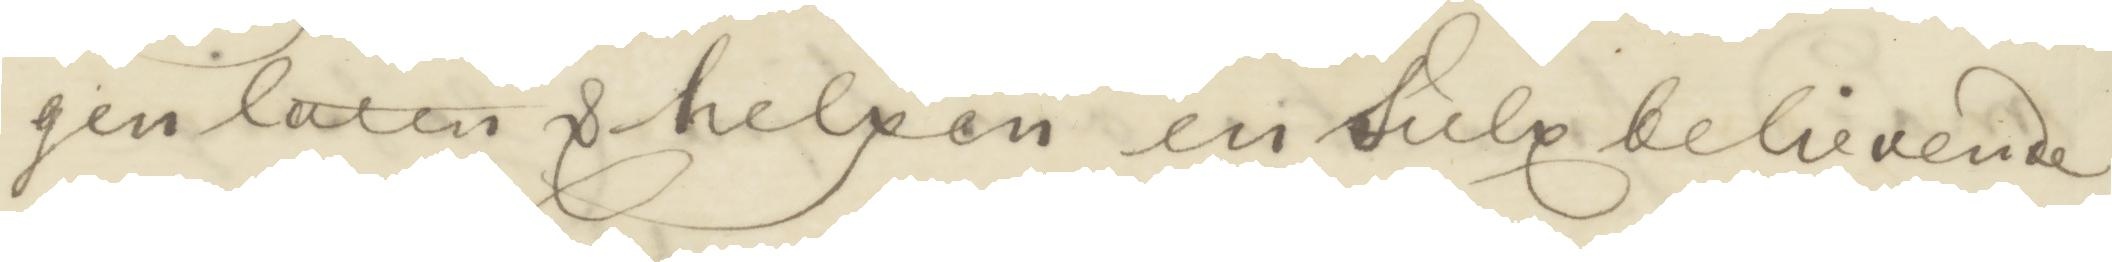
gen laten verhelpen en sulx believende
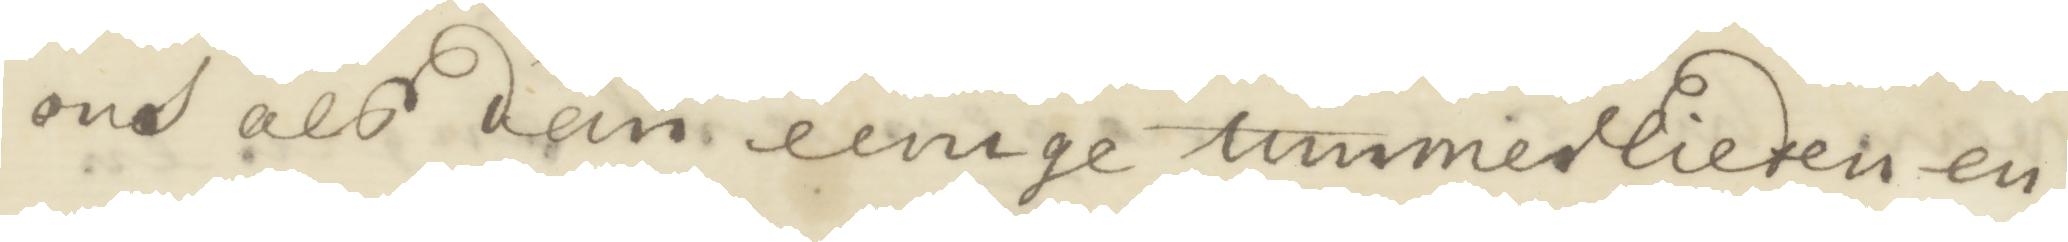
ons als dan eenige timmerlieden en
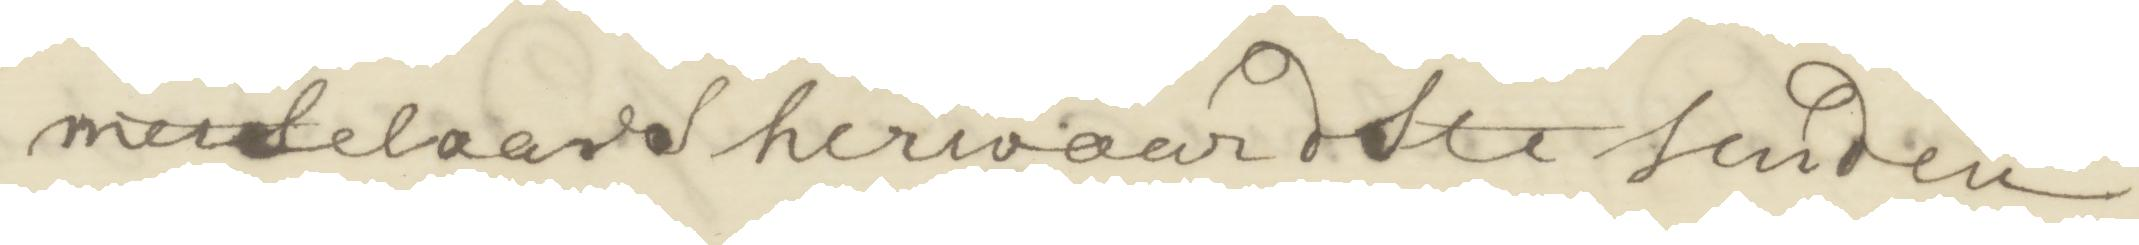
metselaars herwaardste senden
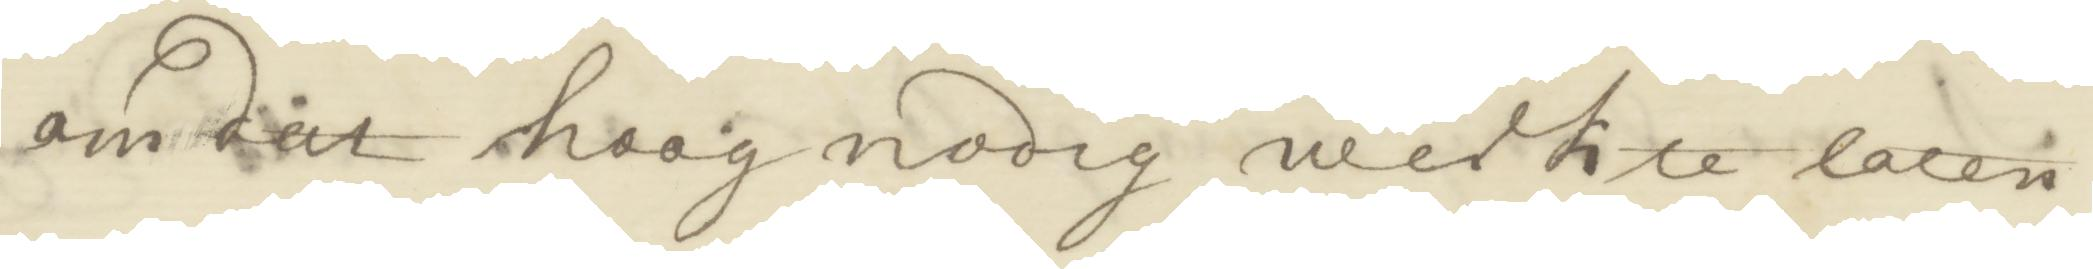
om dat hoog nodig werkte laten
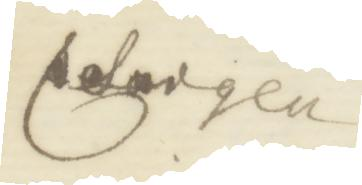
besorgen
